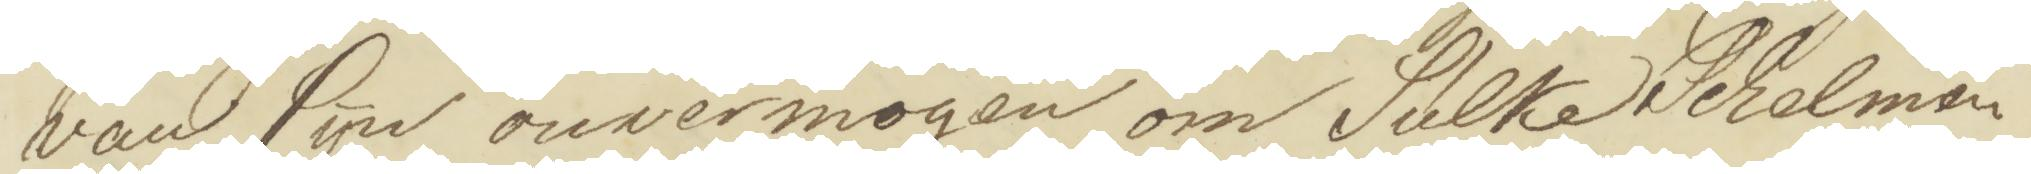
van sijn onvermogen om sulke schelmen
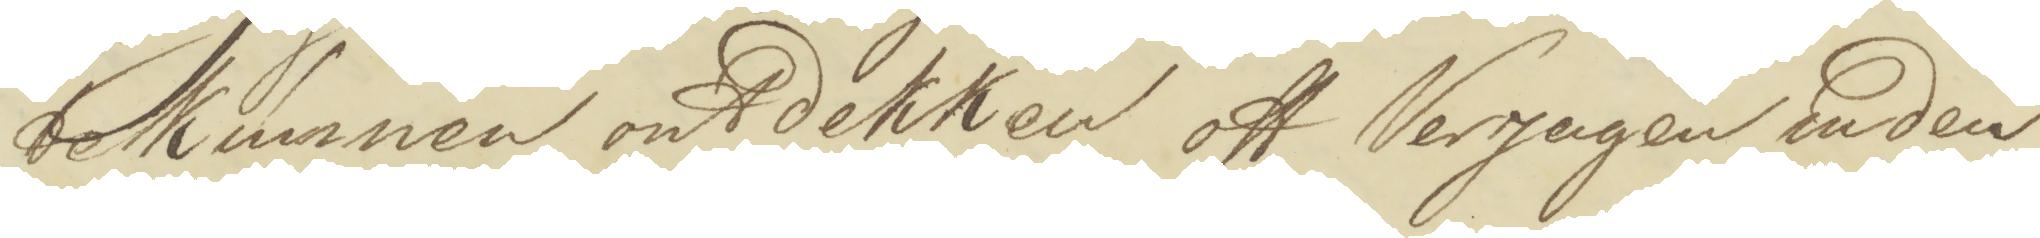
te kunnen ontdekken off verjagen in den
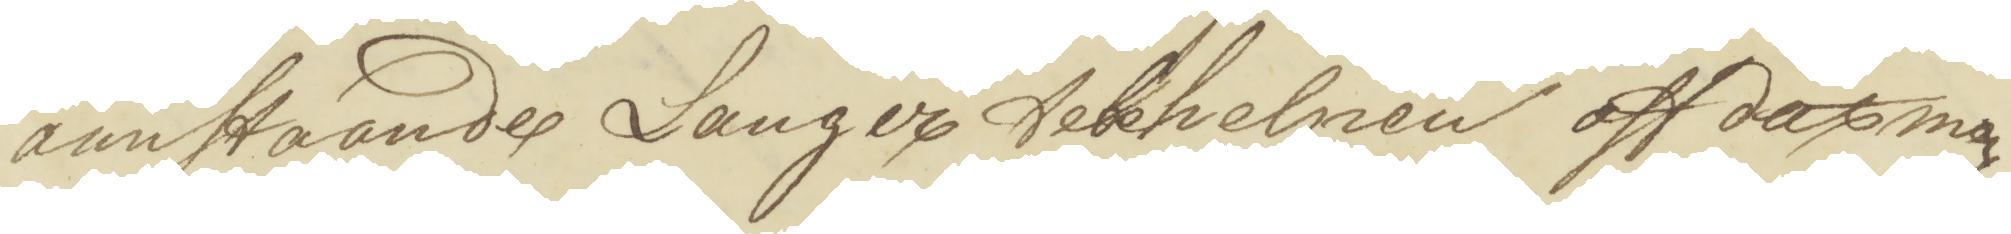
aanstaande Langer te behelpen off dat men
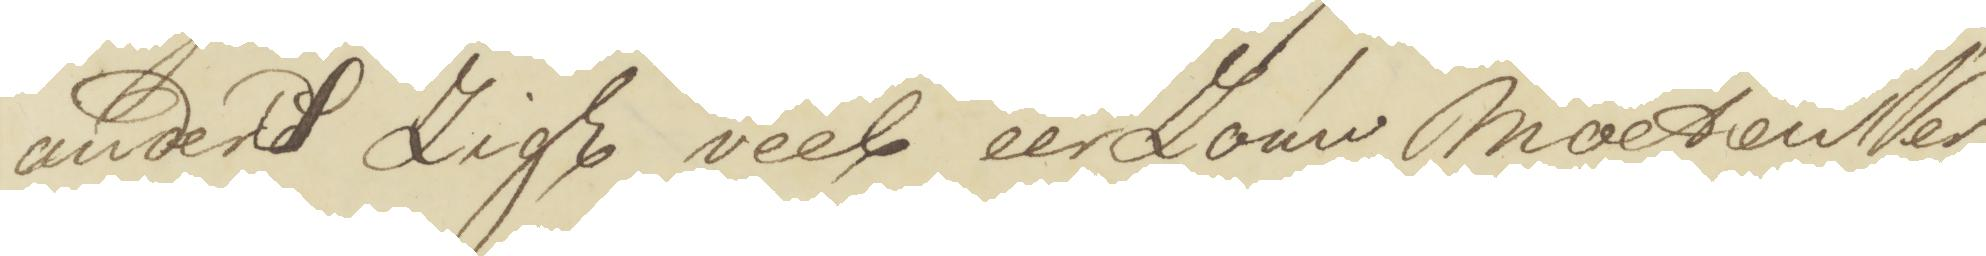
anders zigh veel eer zouw moeten ver
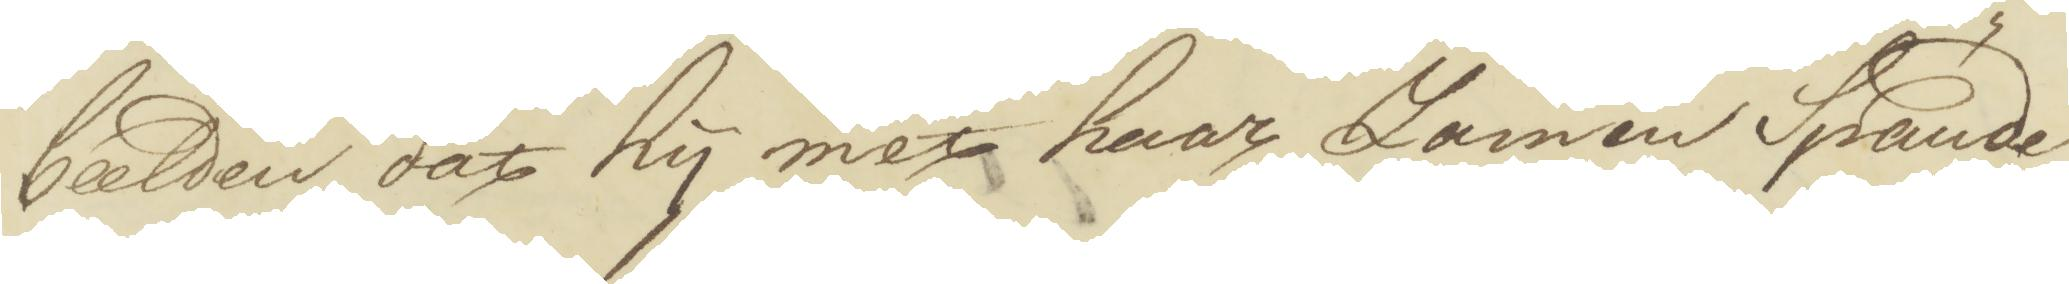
beelden dat hij met haar zamen spande
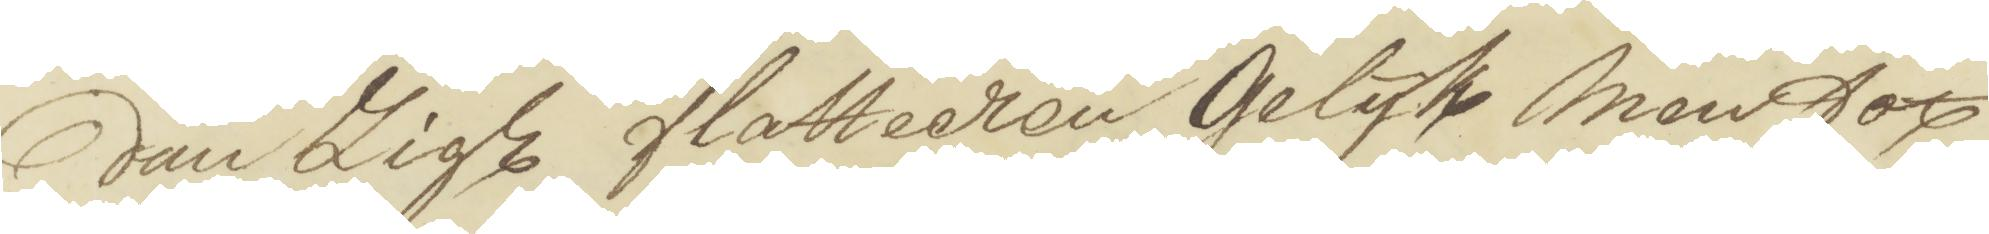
dan zigh flatteeren gelijk men tot
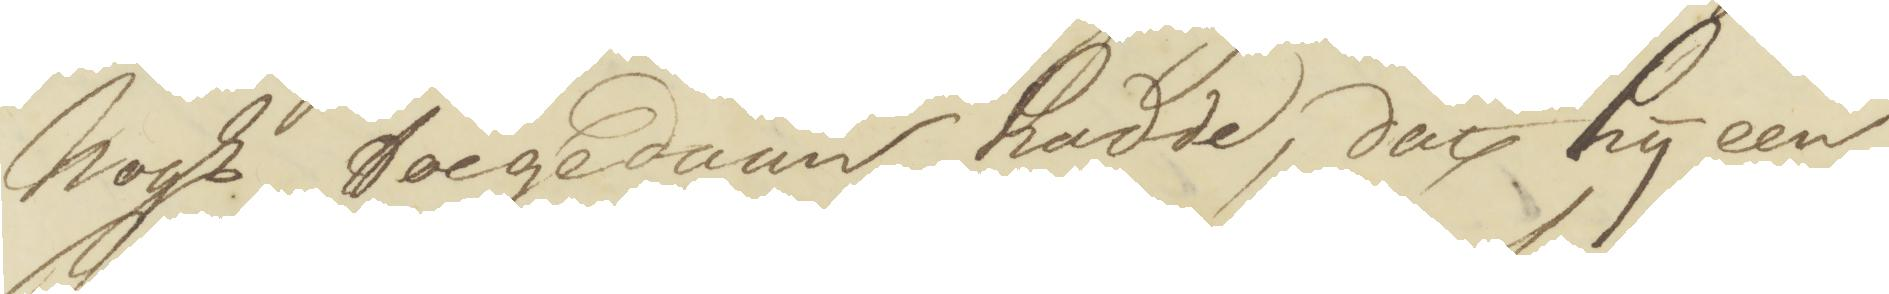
nogh toe gedaan hadde, dat hij een
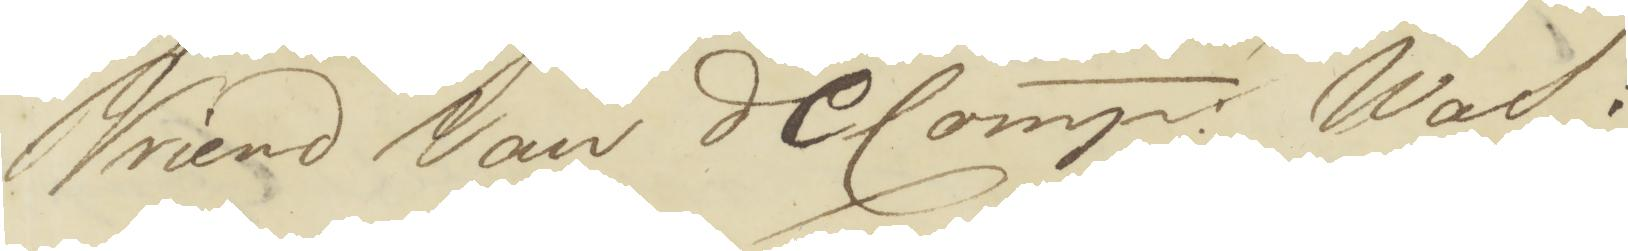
vriend van dE Comp: was;
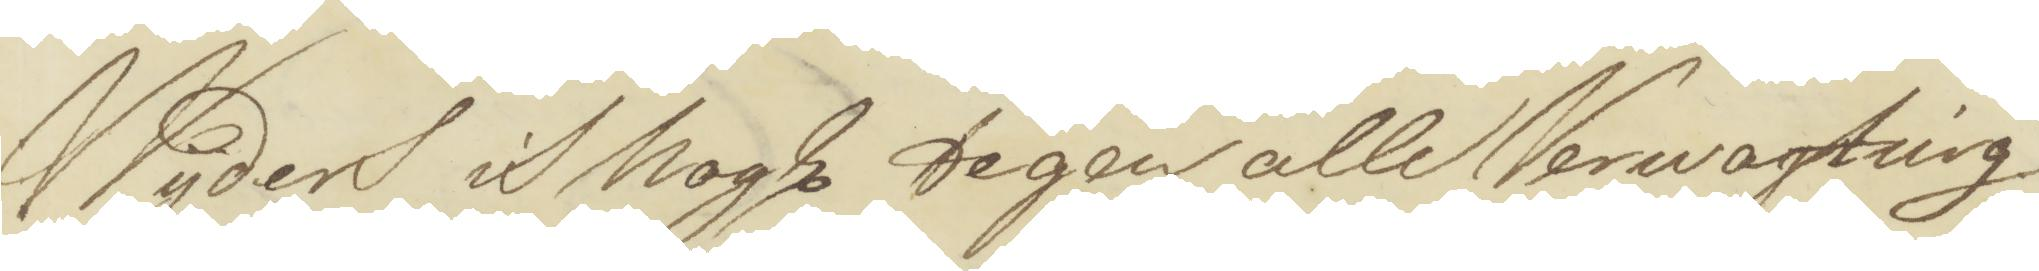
Wijders is nogh tegen alle verwagting
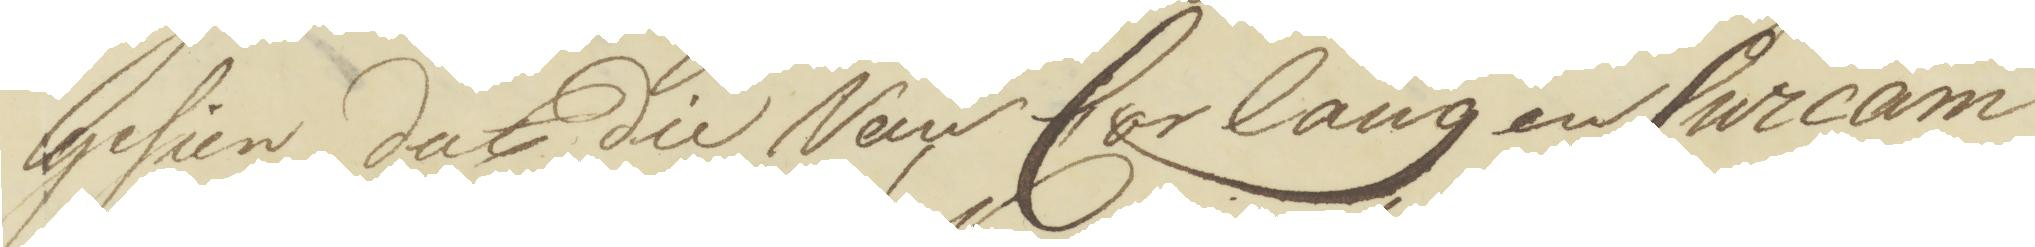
gesien dat die van Corlang en Surcam
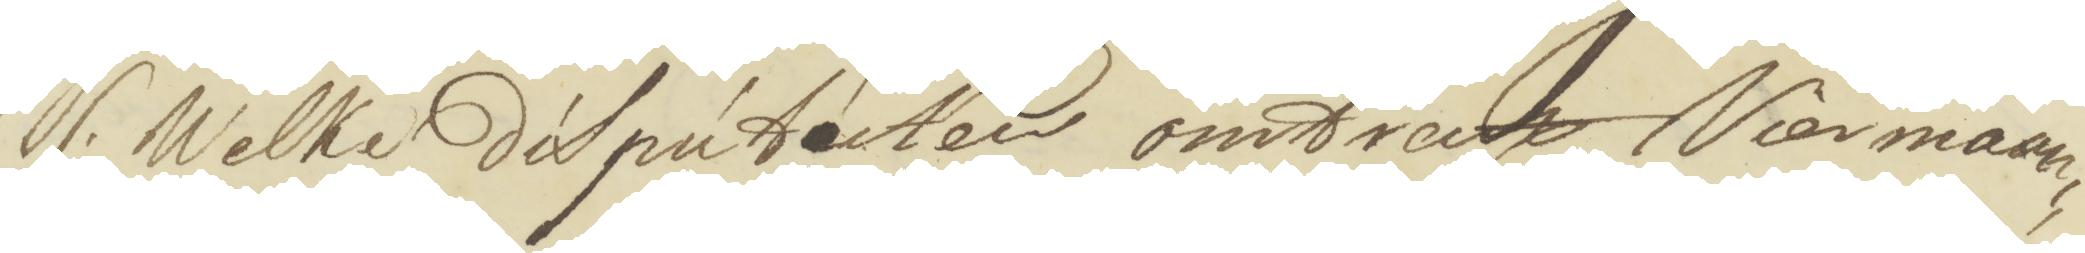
(: welke dispututen omtrent vier maan„
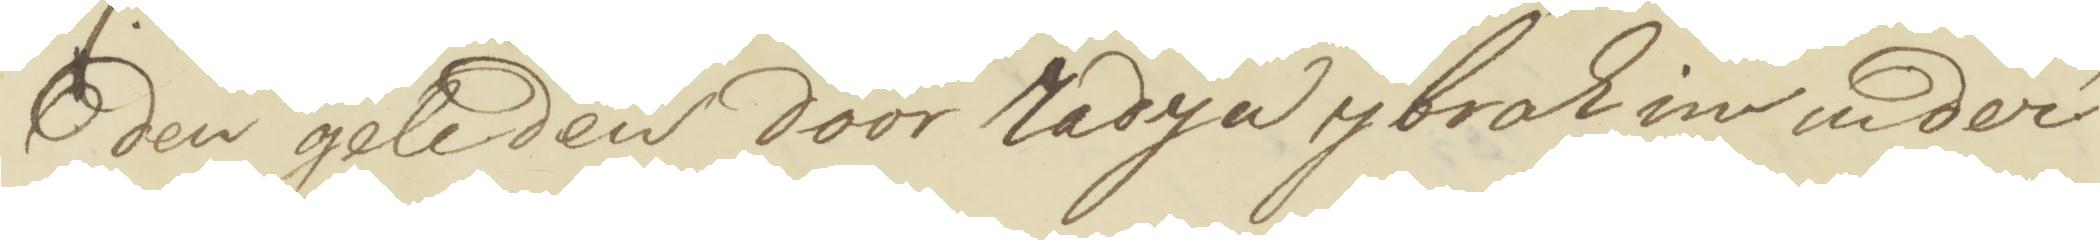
den geleden door radja jbrahim in inder
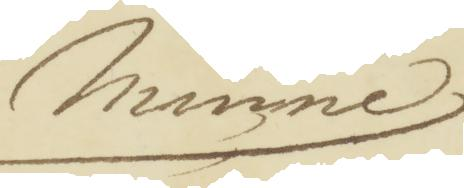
minne
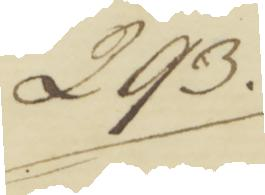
243.
